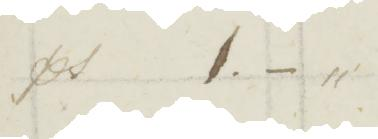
p.s 1. - „
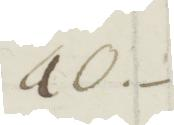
40._
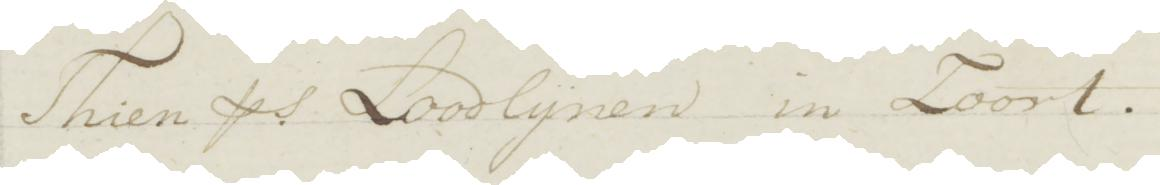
Thien p.s Loodlijnen in Zoort.
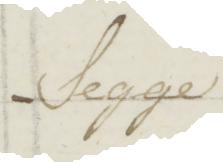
_segge
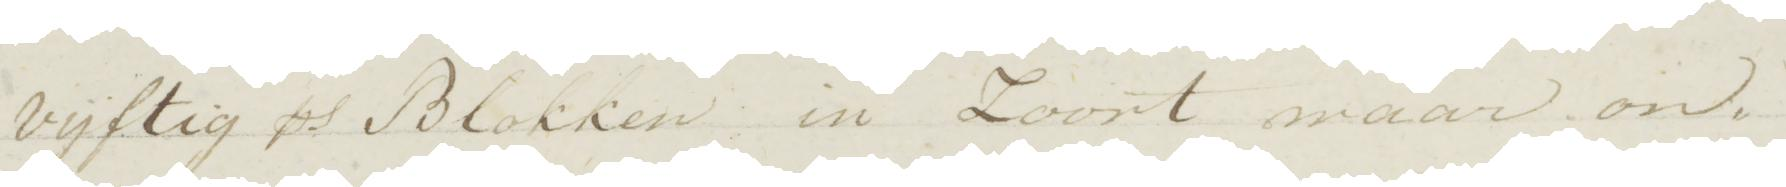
vijftig ps Blokken in Zoort waar on„
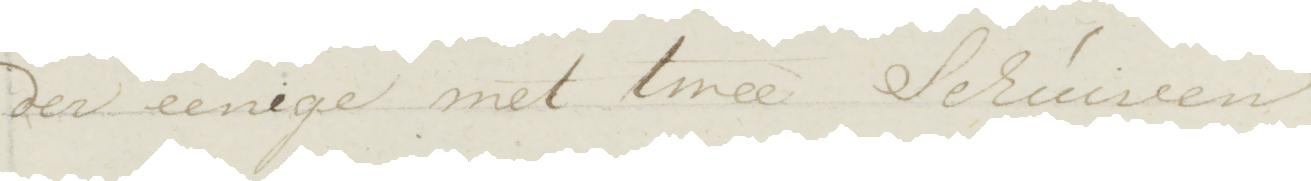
der eenige met twee schuiven
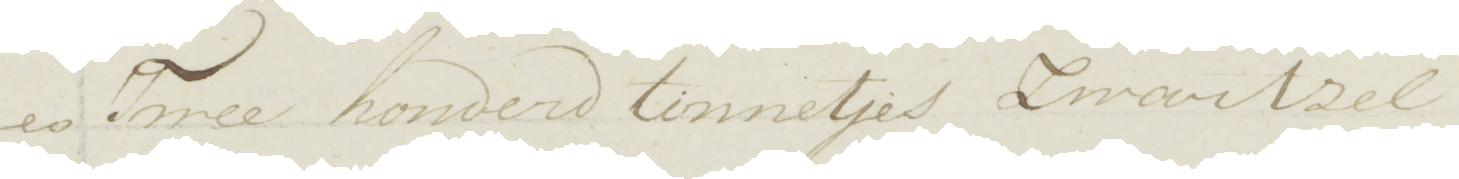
_o Twee honderd tinnetjes Zwartzel
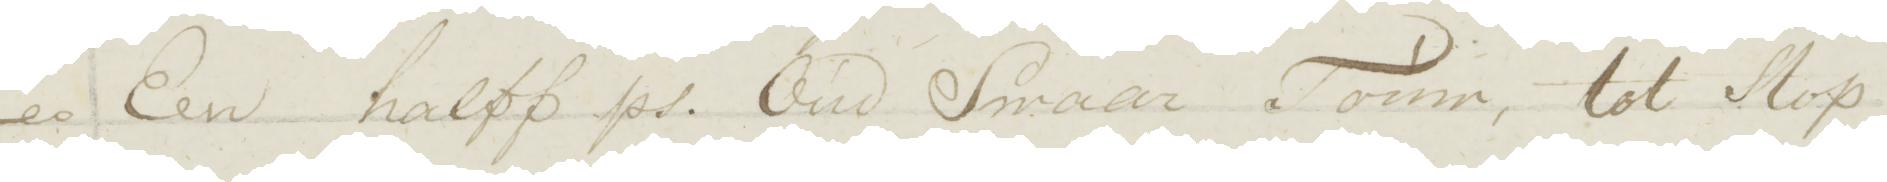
_o Een halff ps. Oud Swaar Touw, tot stop
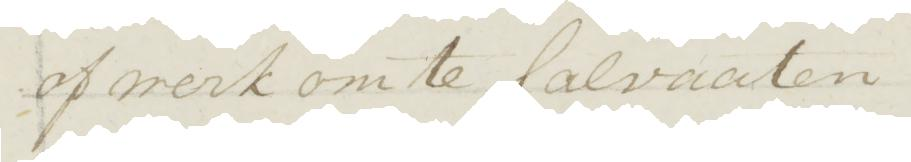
of werk om te calvaaten
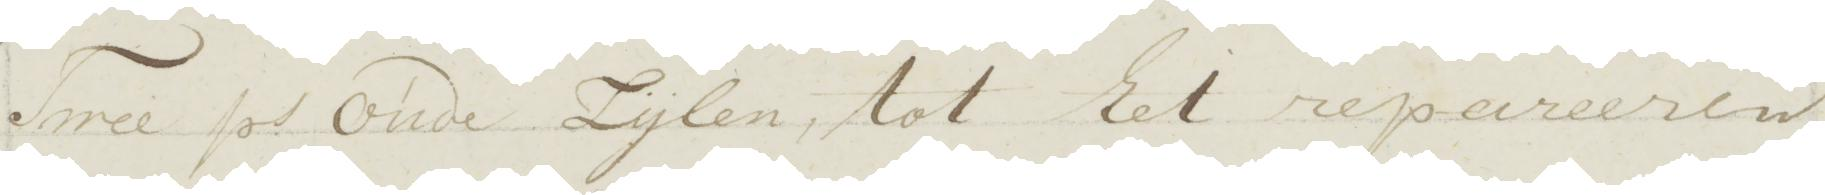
Twee p.s oude zijlen, tot het repareeren
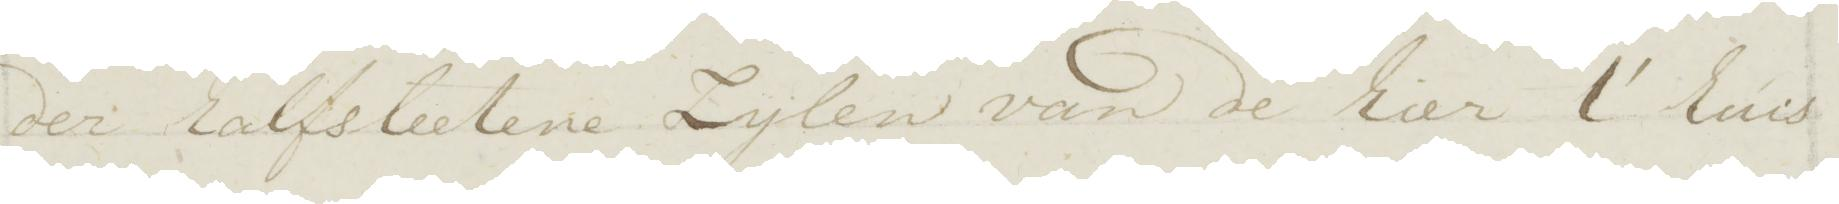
der halfsleetene zijlen van de hier t' huis
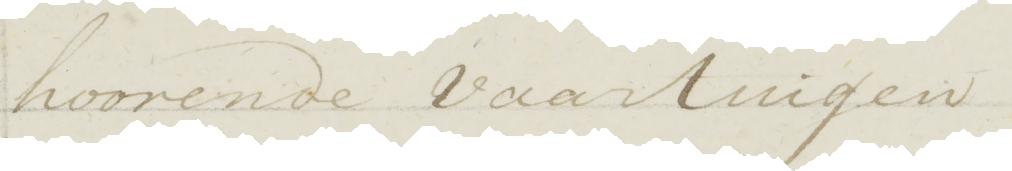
hoorende vaartuigen
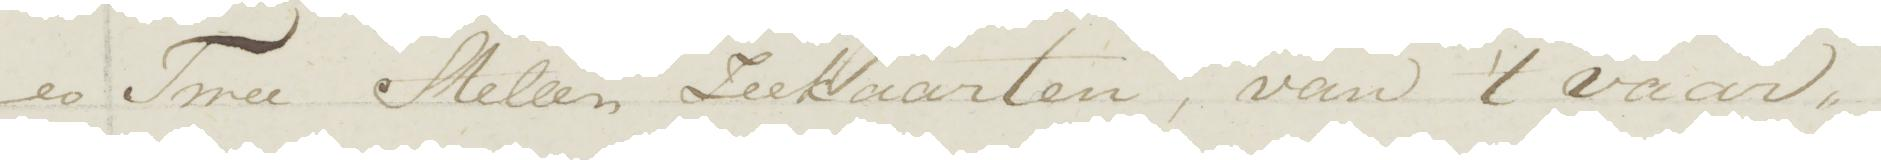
_o Twee stellen zeekaarten, van ’t vaar„
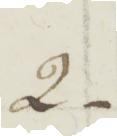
2-
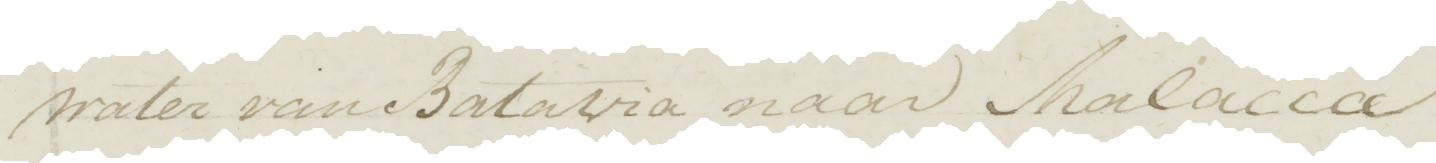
water van Batavia naar Malacca
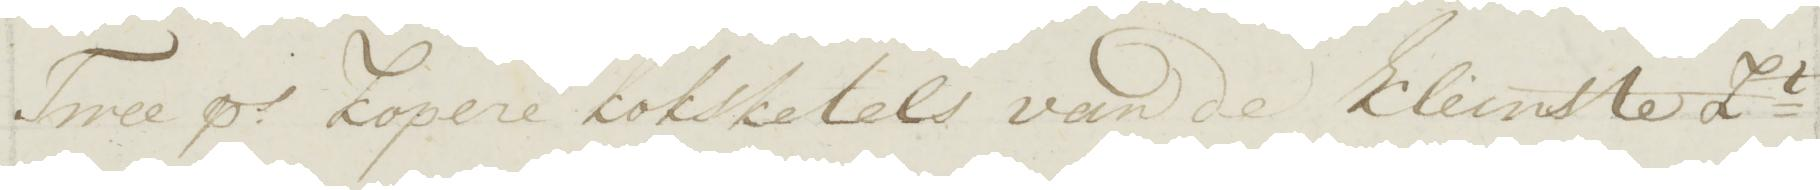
Twee p.s kopere koksketels van de kleinste Z=t
